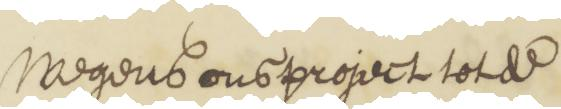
wegens ons project tot de
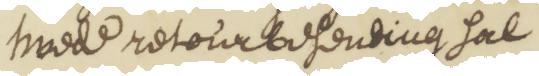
mede retour besending sal
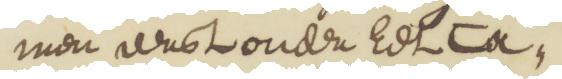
men eerstonder het Ca„
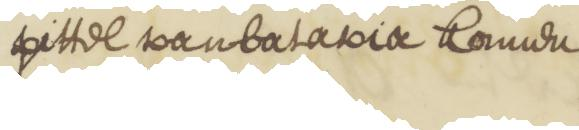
pittel van batavia konnen
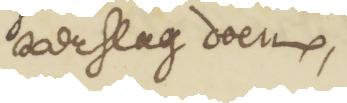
verslag doen,
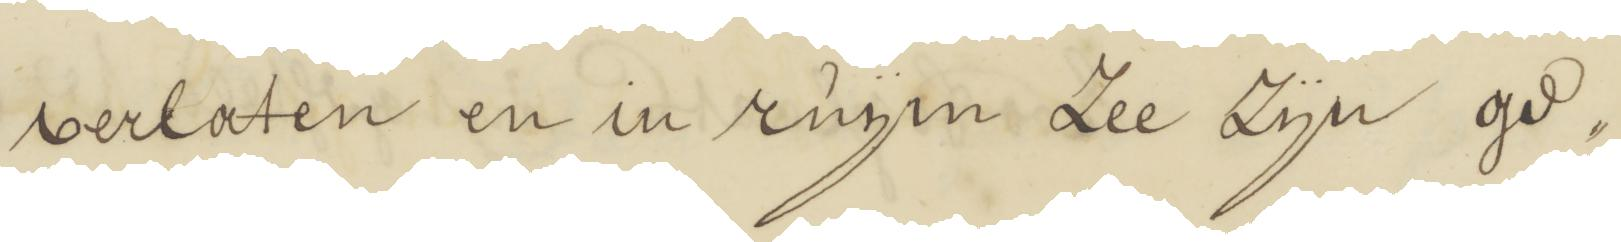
verlaten en in ruijm Zee Zijn ge„
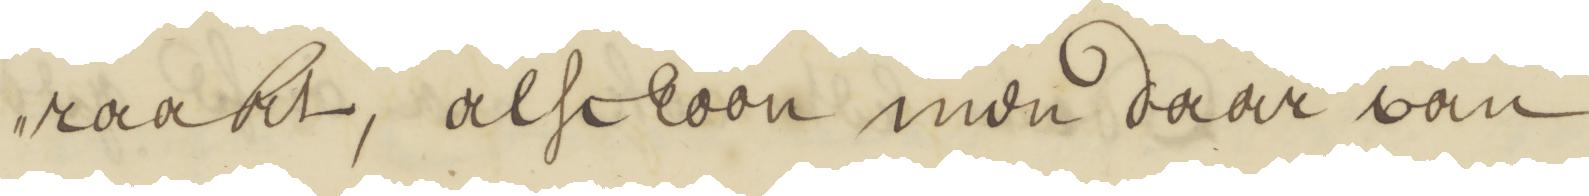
„raakt, alschoon men daar van
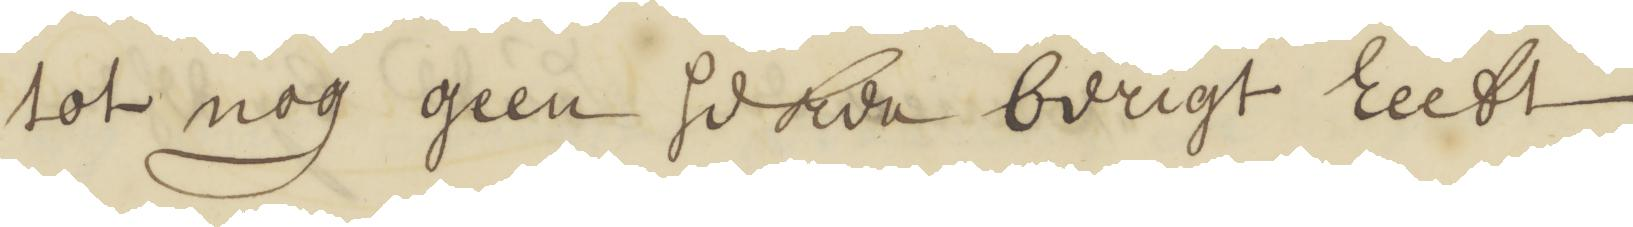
tot nog geen seker berigt heeft
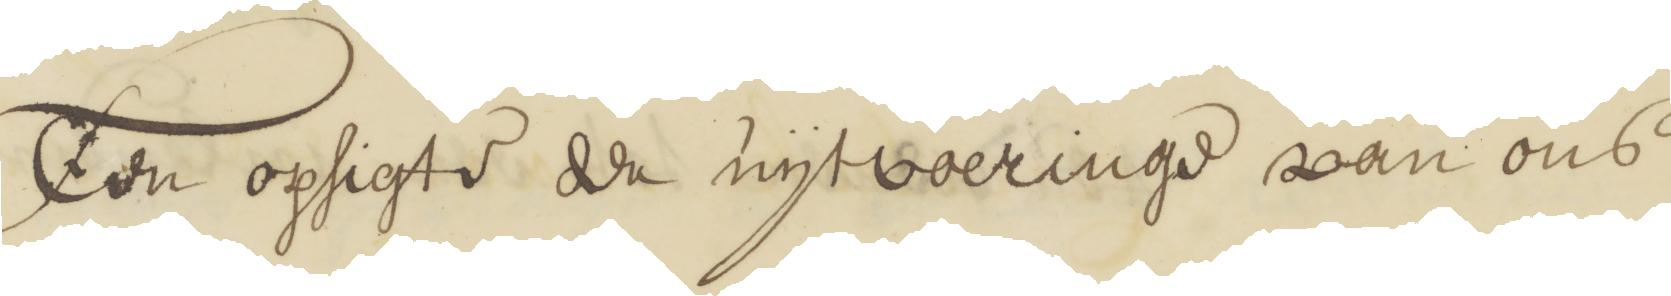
Ten opsigte der uijtvoeringe van ons
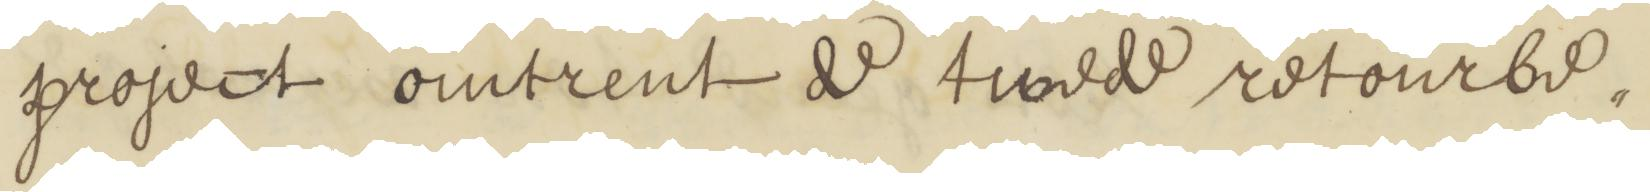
project omtrent de twede retourbe„
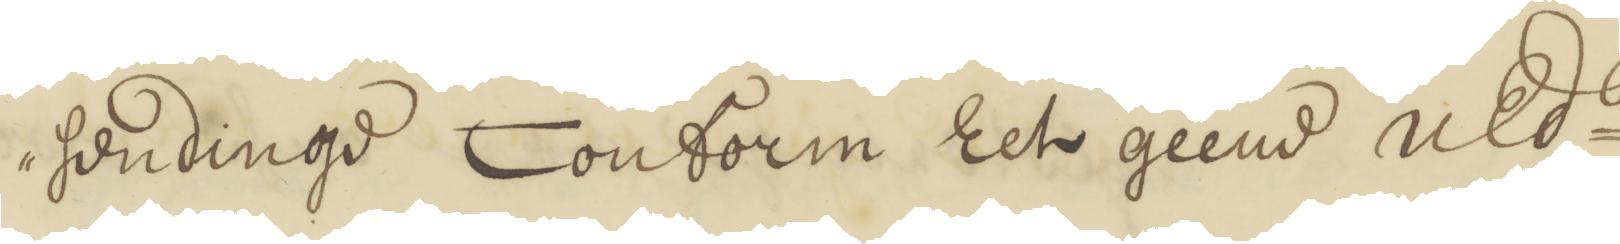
„sendinge conform het geene uEd=le
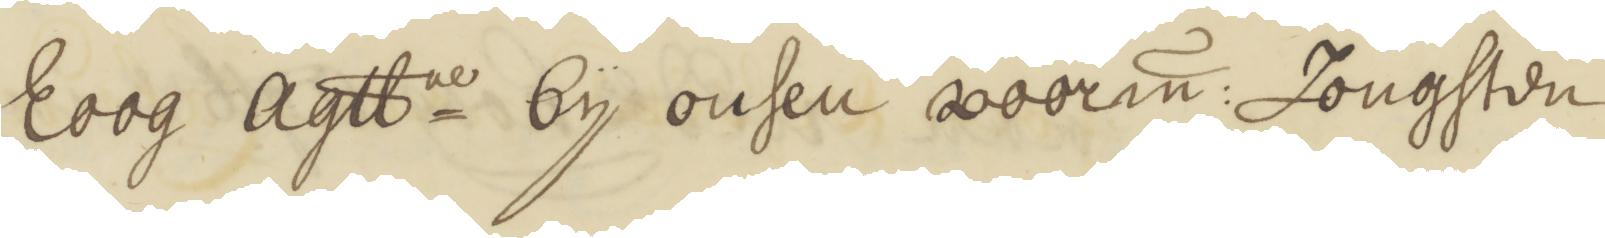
hoog Agtb=re bij onsen voorm: Jongsten
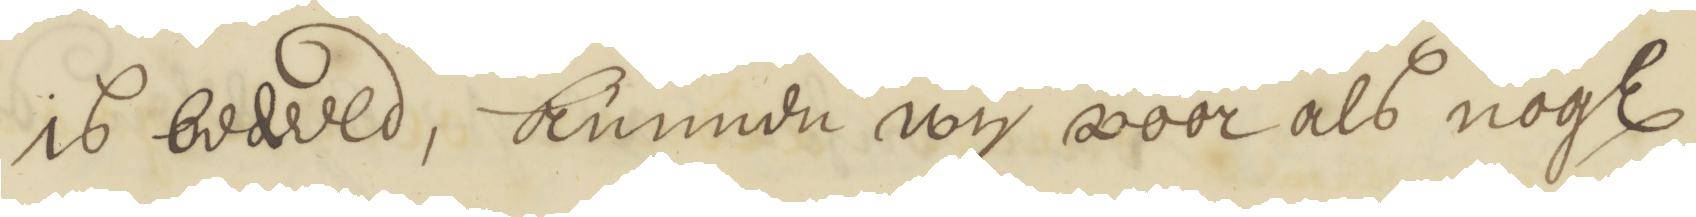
is bedeeld, kunnen wij voor als nogh
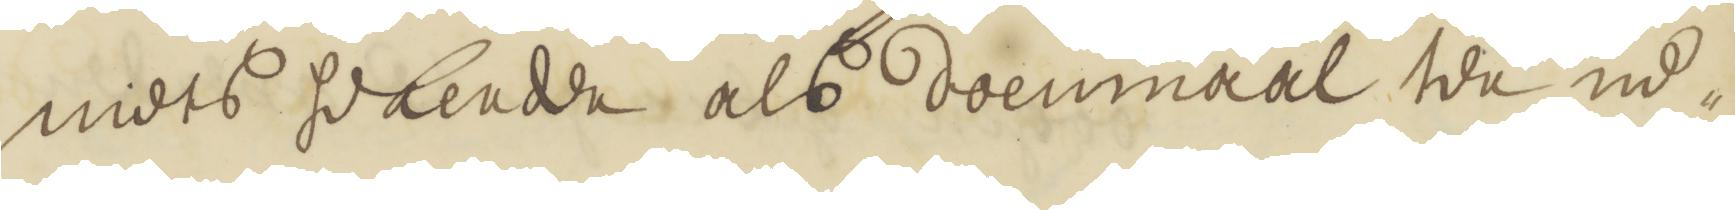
niets sekerder als doenmaal ter ne„
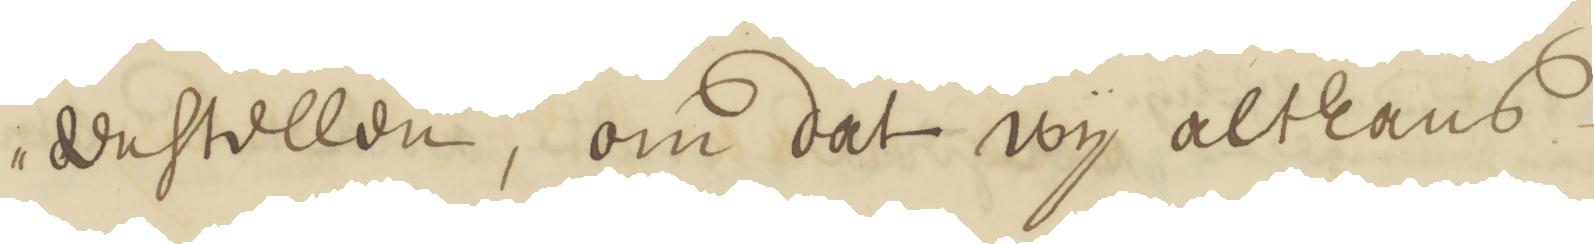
„derstellen, om dat wij althans
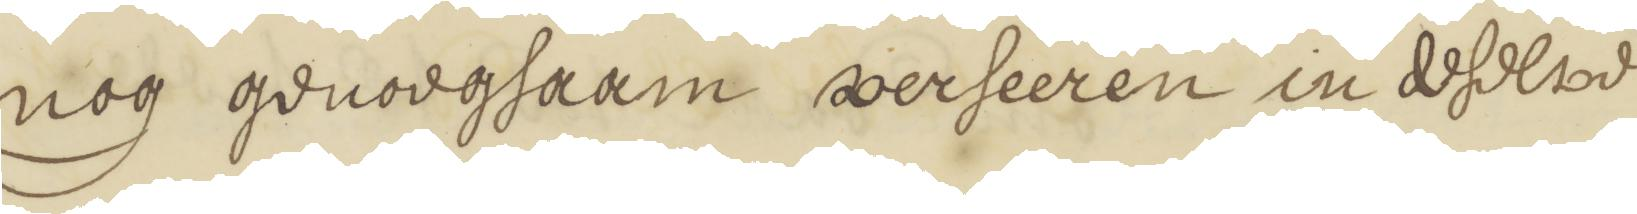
nog genoegsaam verseeren in deselve
